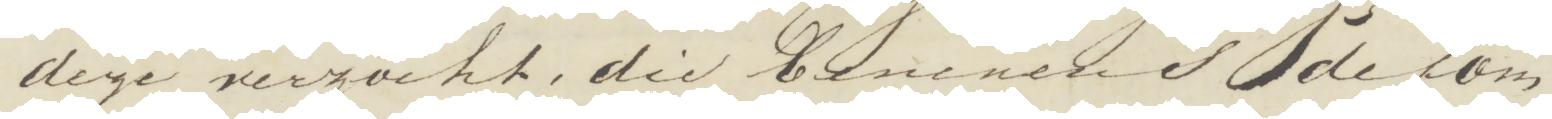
deze verzocht, die benevens de Com
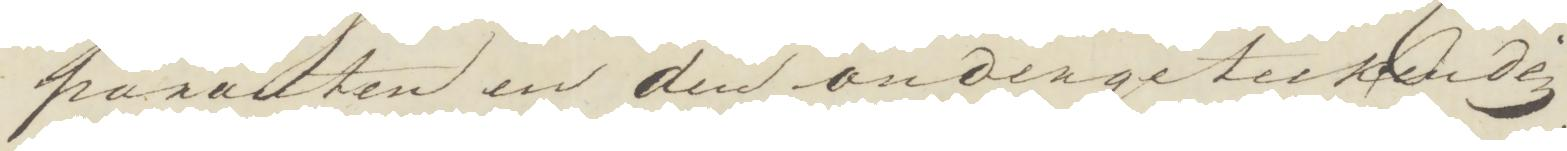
paranten en den ondergeteekenden
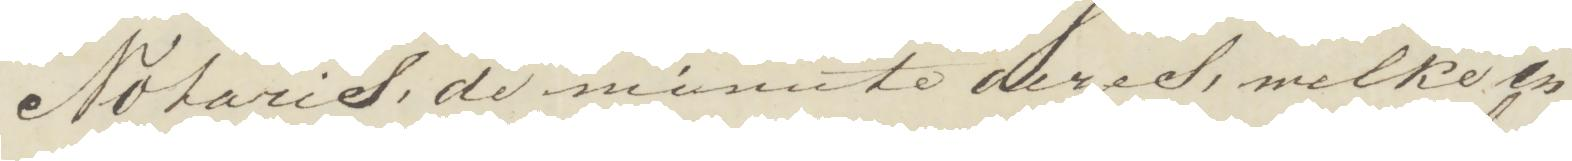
Notaris, de minute dezes, welke in
